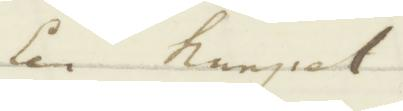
Een lampet
